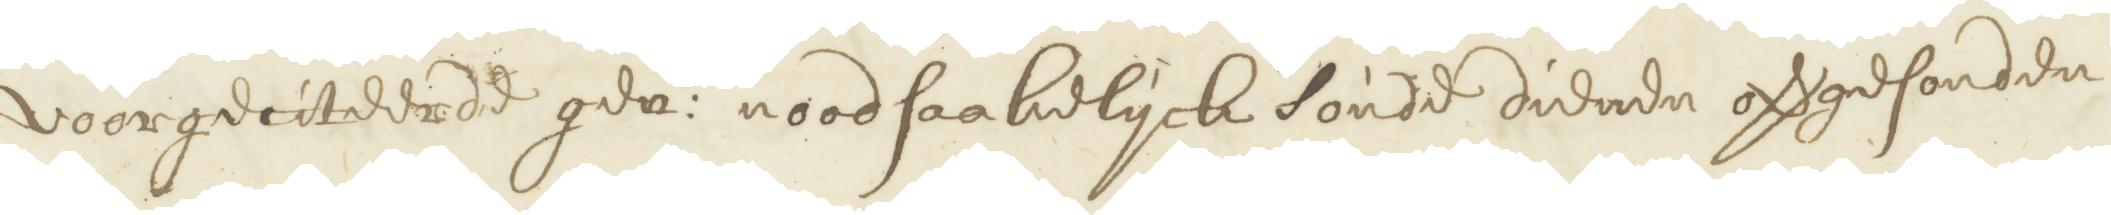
voorgeciteerde gev:s noodsaakelijck soude dienen overgesonden
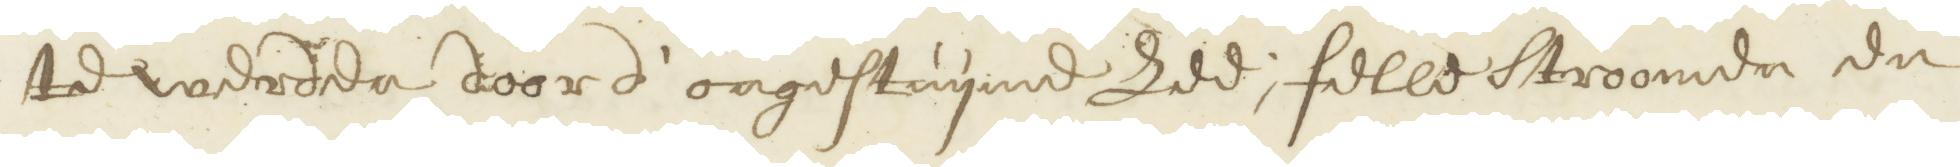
te werden door d’ ongestuijme Zee, felle stroomen en
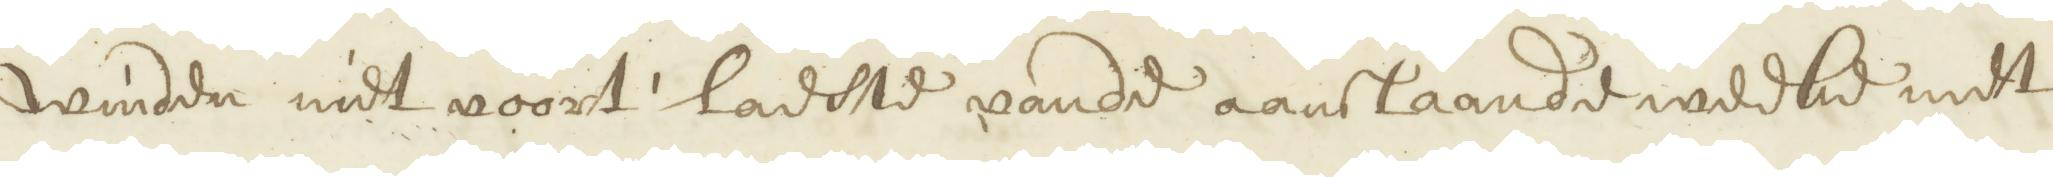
winden niet voort' laeste vande aanstaande weeke met
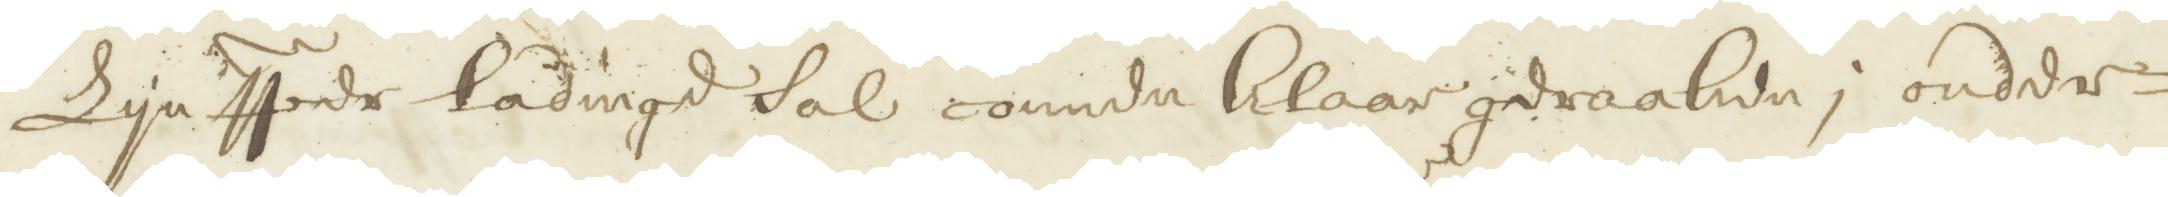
Zijn peper ladinge Sal connen klaar geraaken; onder=
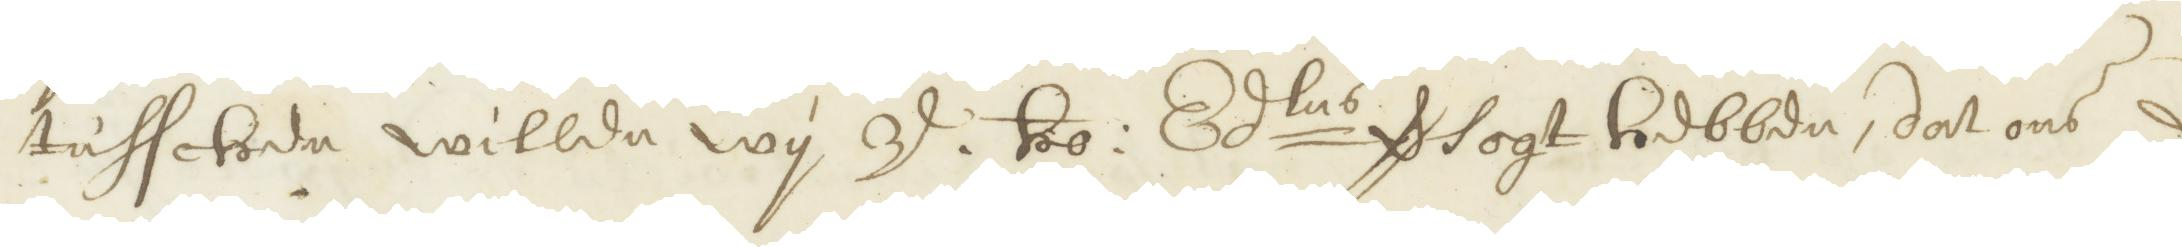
tusschen willen wij V. ho: Ed=lns Versogt hebben, dat ons
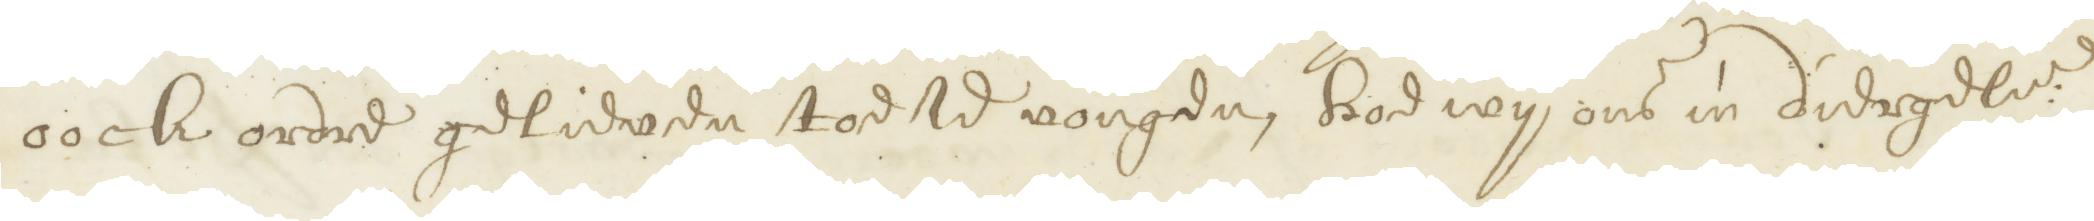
oock ordre gelieven toe te vougen, hoe wij ons in diergelijke
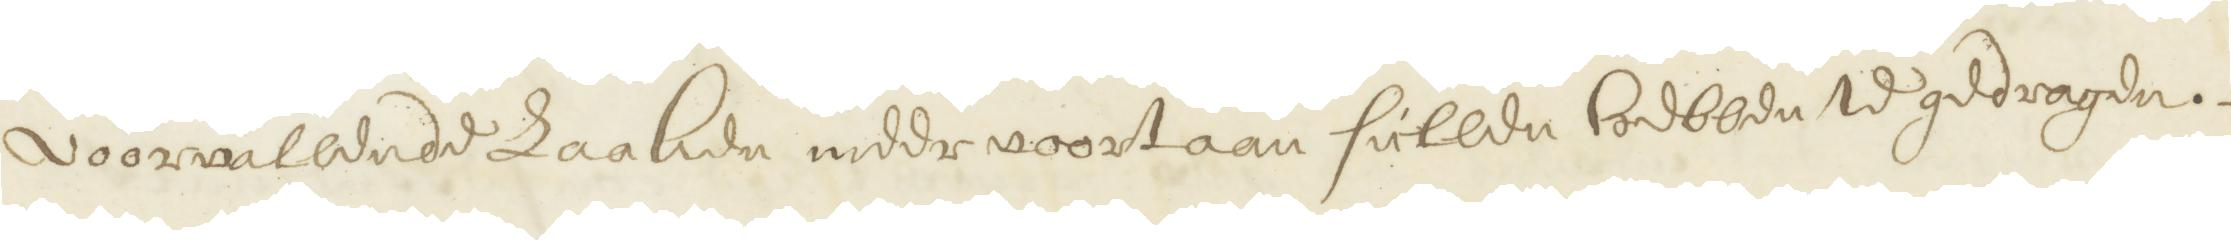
voorvallende Zaaken meer voortaan sullen hebben te gedragen.
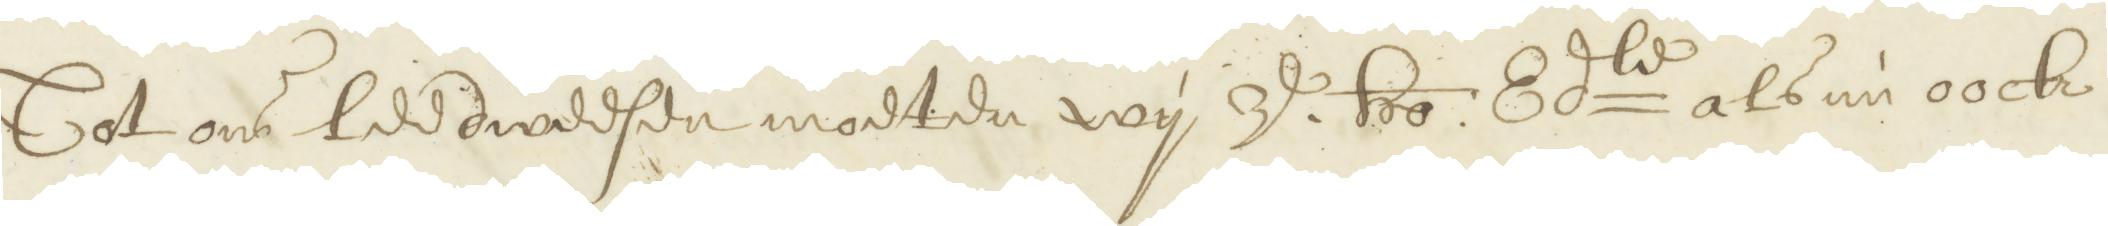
Tot ons leedweesen moeten wij V. ho: Ed=le als nu oock
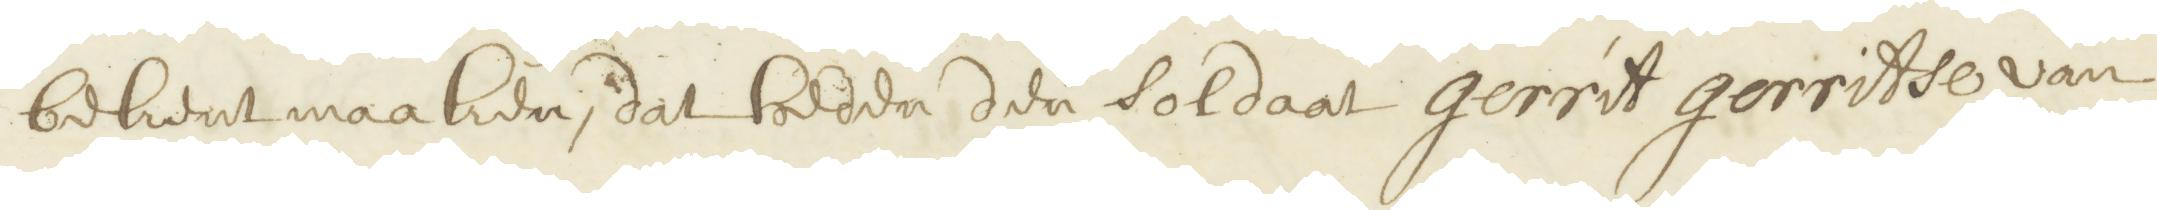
bekent maaken, dat heden den soldaat gerrit gerritse van
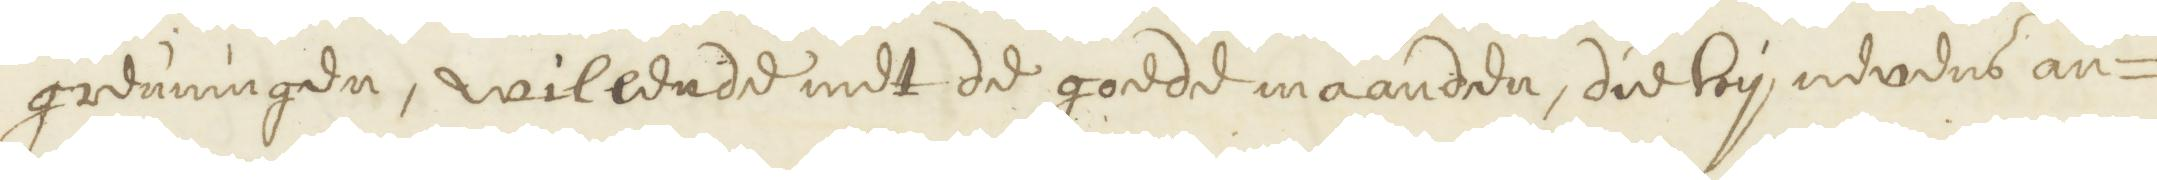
greuningen, willende met de goede maanden, die hij nevens an=
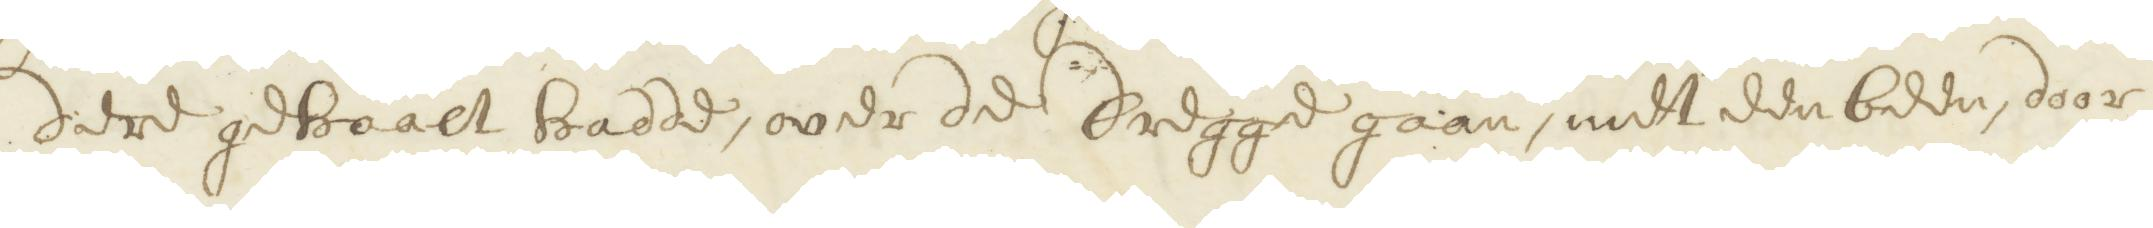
dere gehaalt hadde, over de dregge gaan, met een been, door
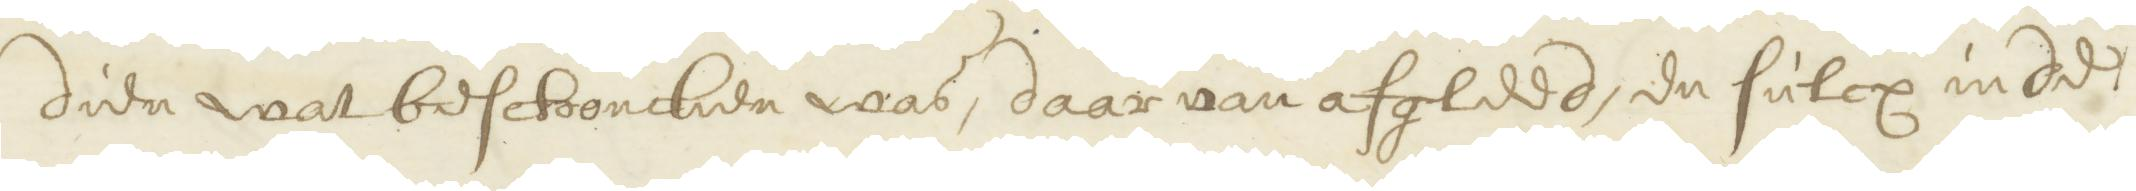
dien wat beschoncken was, daar van afgleed, en sulcx in de
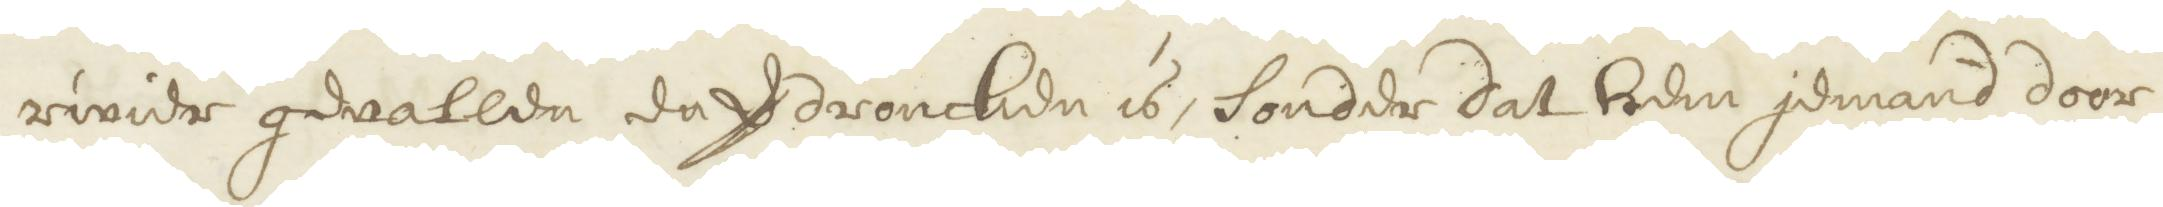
rivier gevallen en verdroncken is, Sonder dat hem jemand door
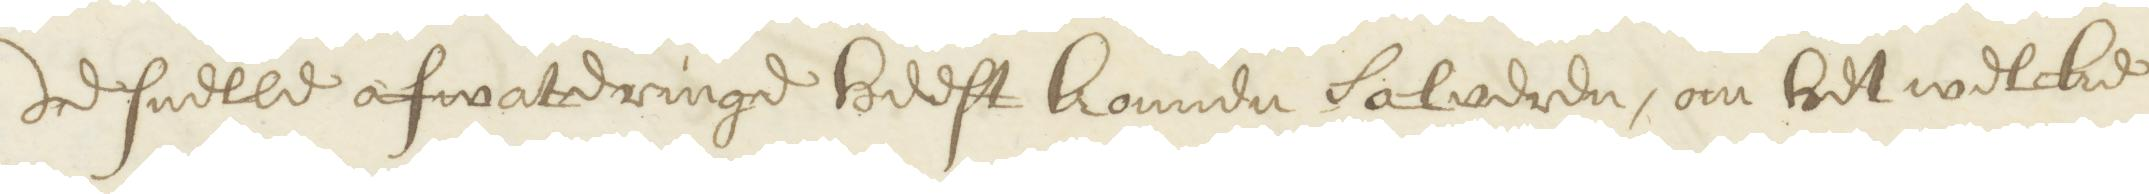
de snelle afwateringe heeft konnen salveren, om het welcke
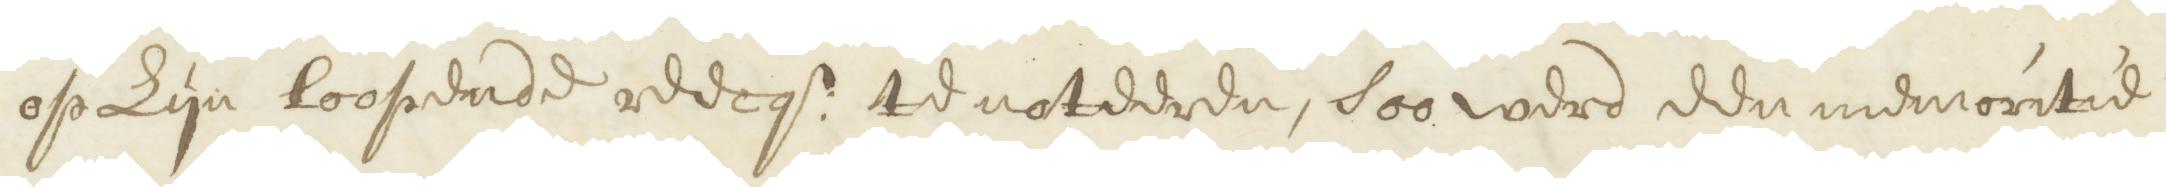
op Zijn loopende reecq:' te noteeren, Soo werd een memoritie
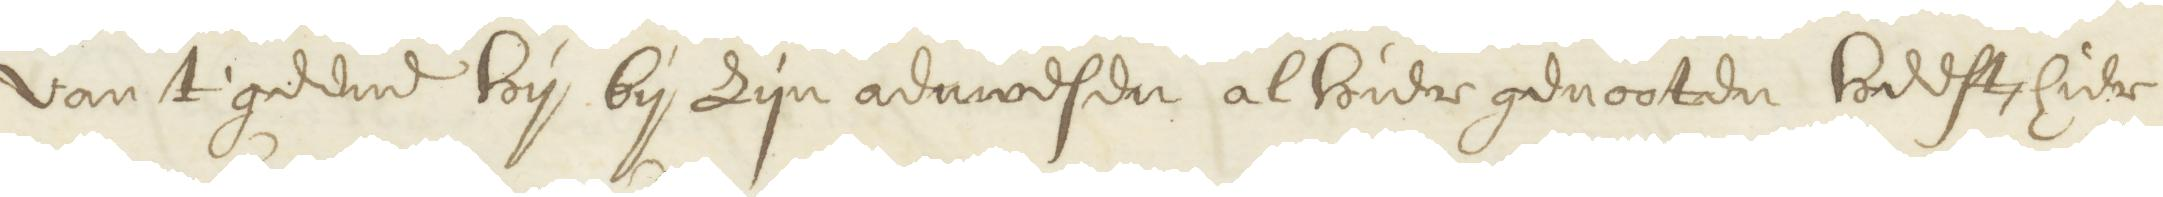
van t'geene hij bij Zijn aenwesen al hier genooten heeft, hier
